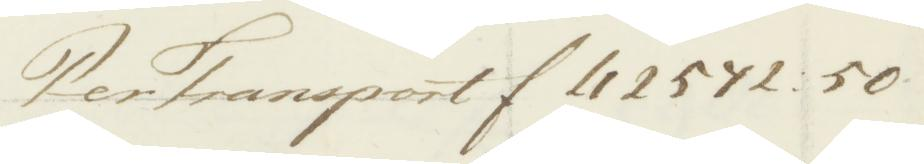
Per transport ƒ 42572: 50
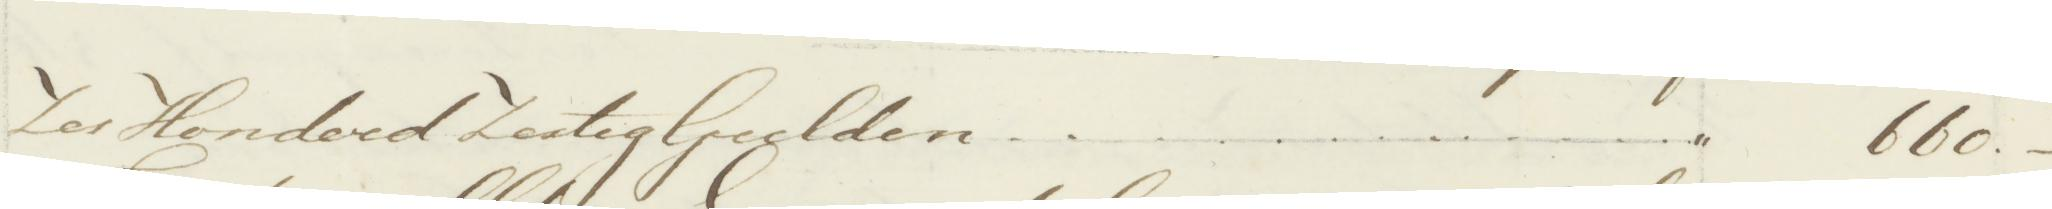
Zes Honderd Zestig Gulden . . . . . . . . . . . . . . „ 660. —
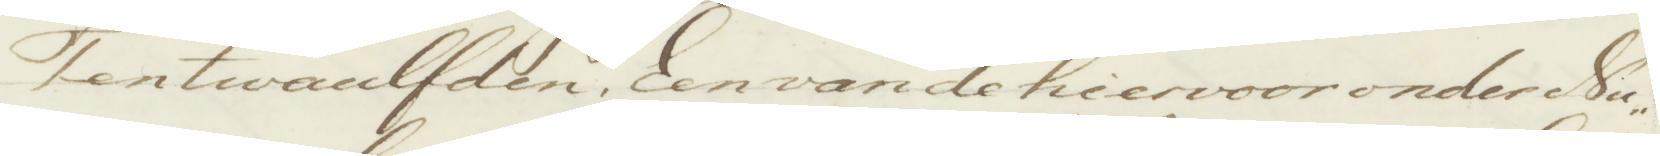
Ten twaalfden, Een van de hiervoor onder Nu„
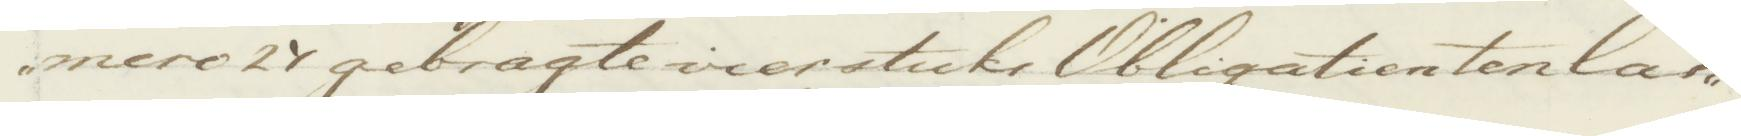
„mero 27 gebragte vier stuks Obligatien ten las„
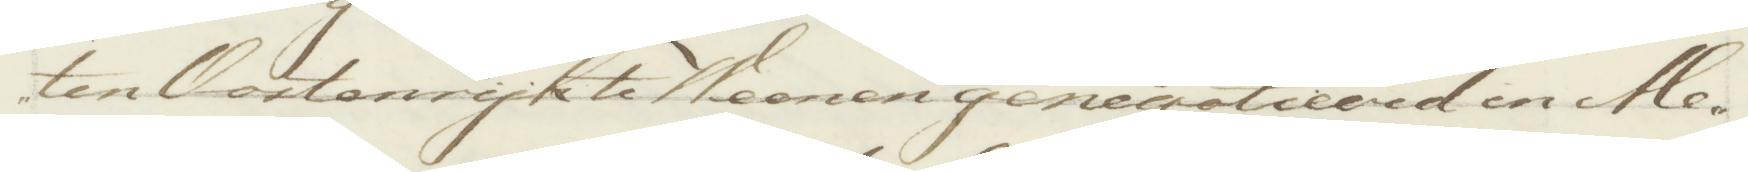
„ten Oostenrijk te Weenen genegotieerd in Me„
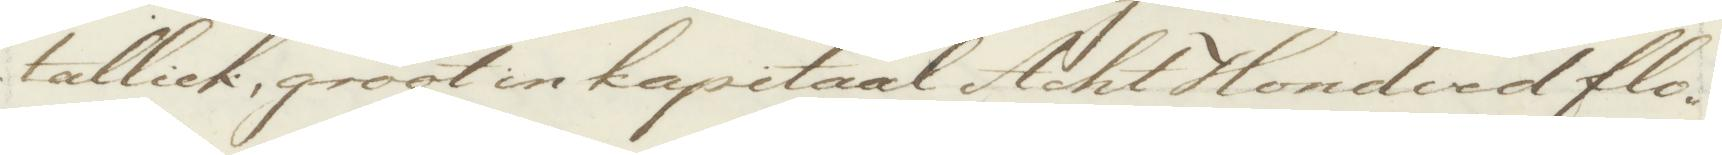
„talliek, groot in kapitaal Acht Honderd flo„
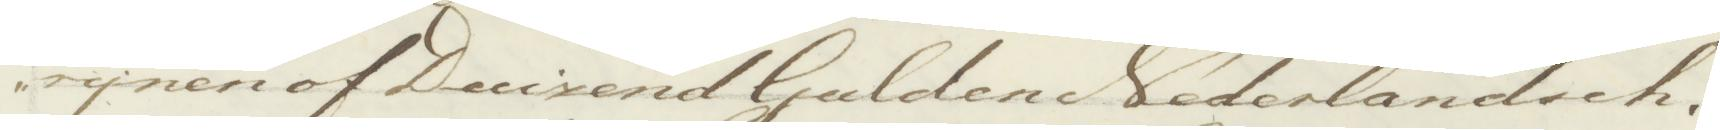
„rijnen of Duizend Gulden Nederlandsch,
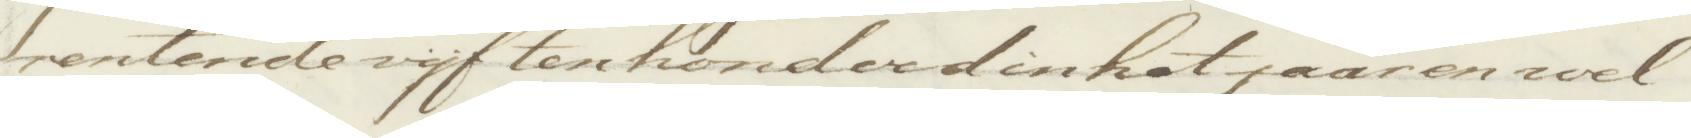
rentende vijf ten honderd in het jaar en wel
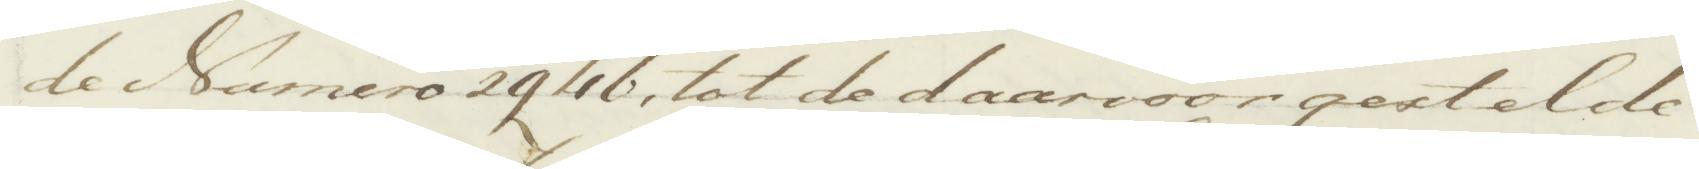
de Numero 2946, tot de daarvoor gestelde
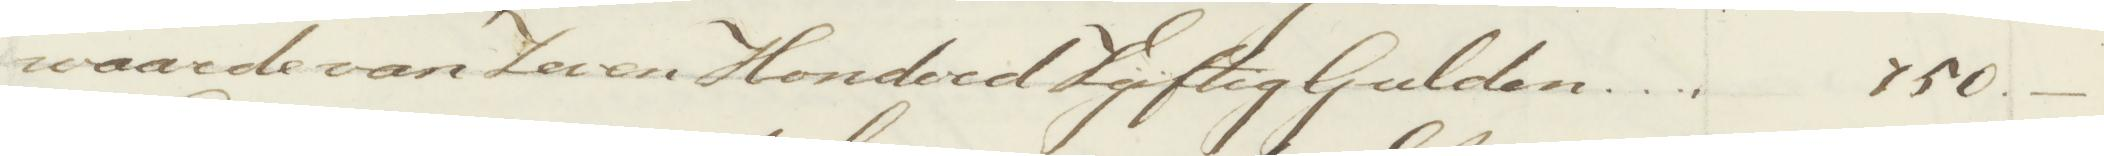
waarde van zeven Honderd Vijftig Gulden . . . , 750. —
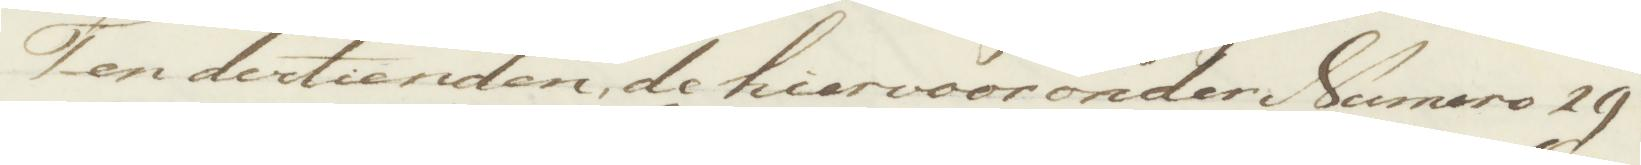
Ten dertienden, de hiervoor onder Numero 29
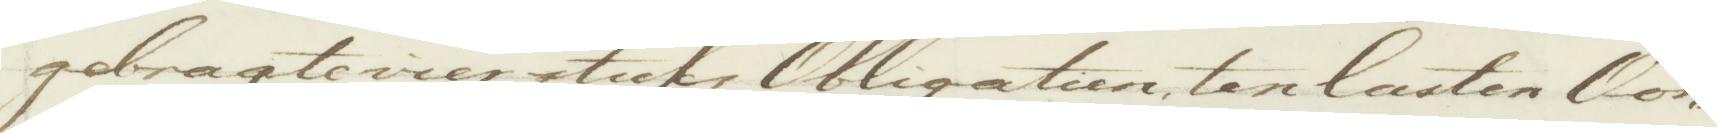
gebragte vier stuks Obligatien, ten lasten Oos
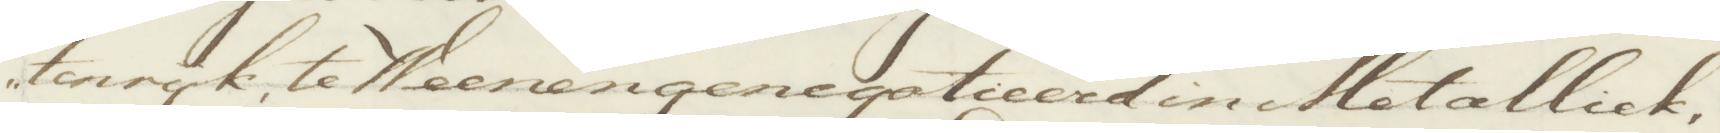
„tenrijk, te Weenen genegotieerd in Metalliek,
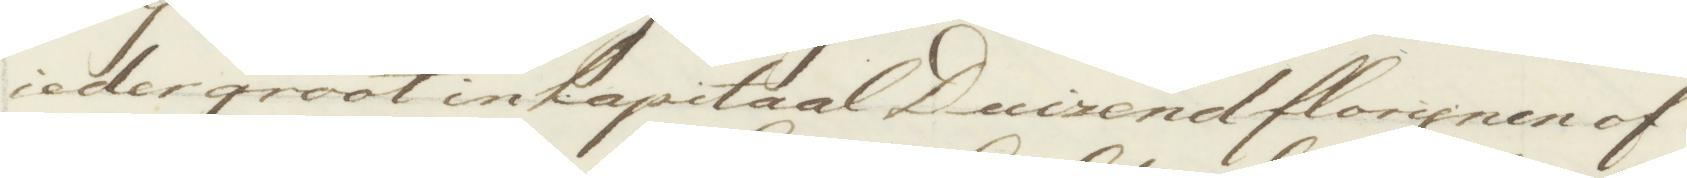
ieder groot in kapitaal Duizend florijnen of
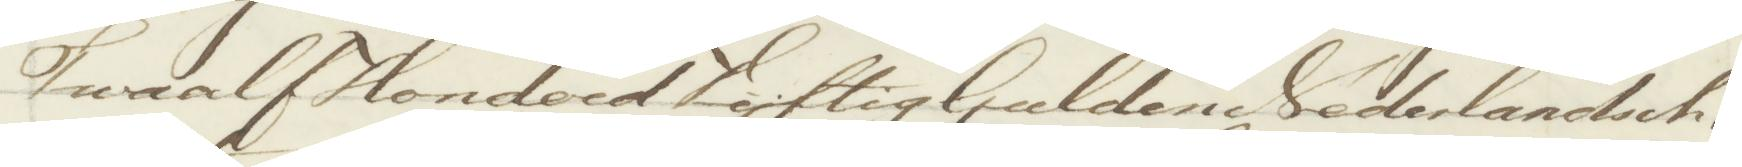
Twaalf Honderd Vijftig Gulden Nederlandsch,
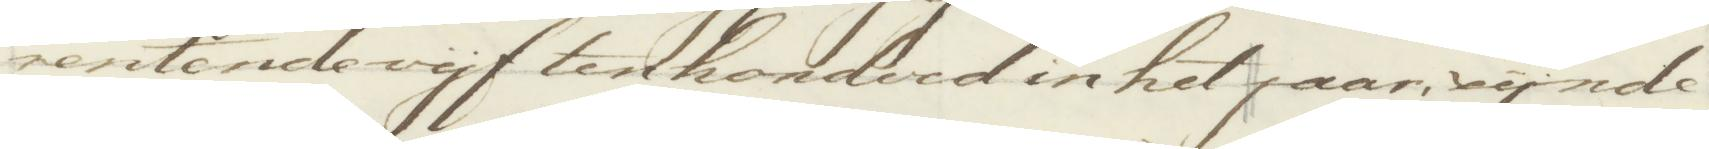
rentende vijf ten honderd in het||jaar, zijnde
